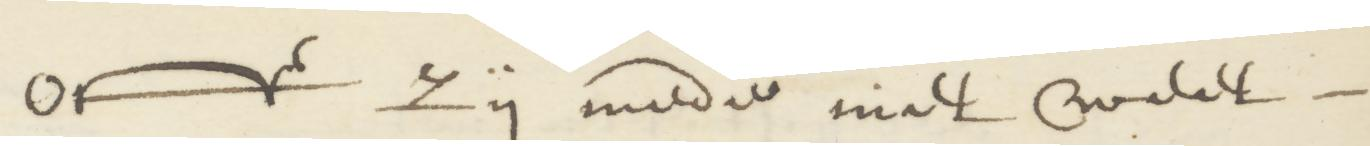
off zij mede niet weet —
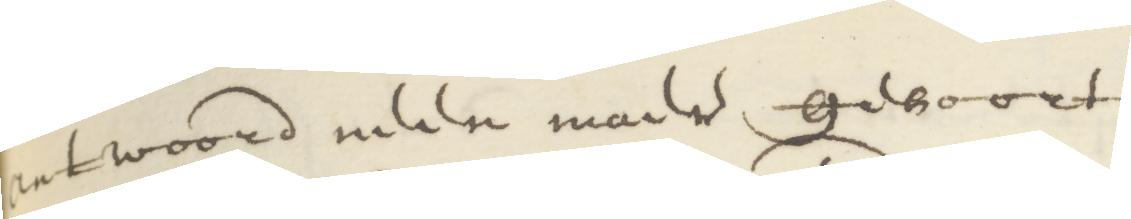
Antwoord neen maer gehoort
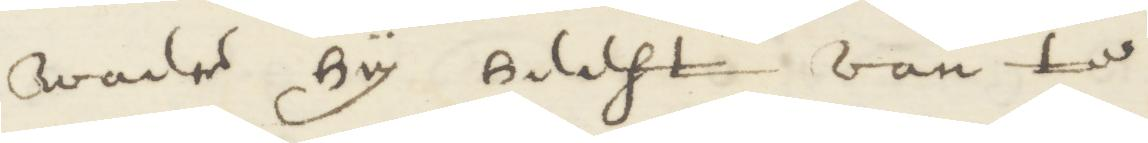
waer hij heeft van te
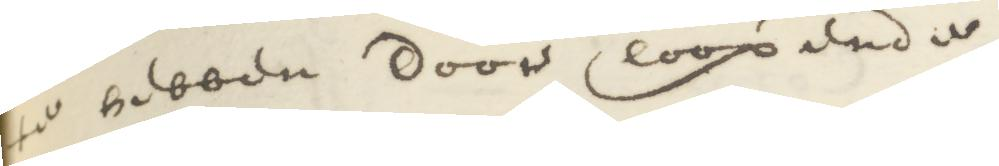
te hebben door loopende
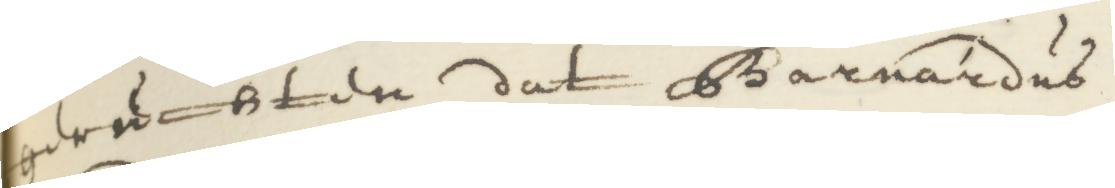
geruchten dat Barnardus
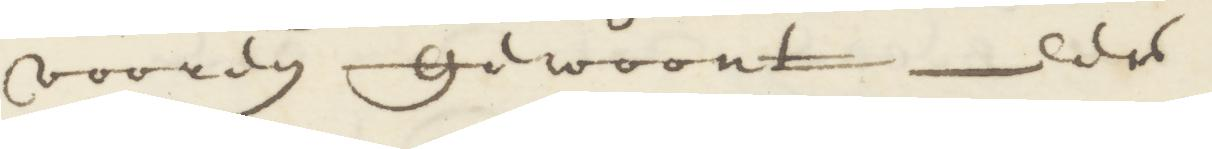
vooren gewoont eer
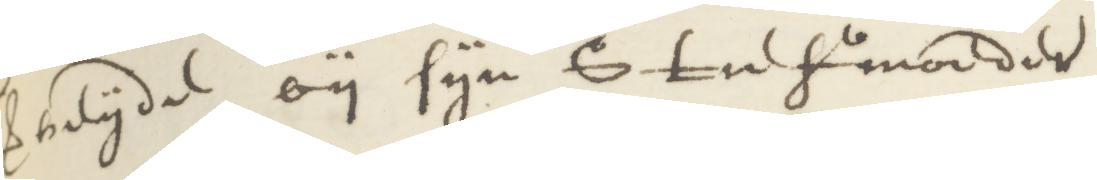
Verheijde bij sijn Stiefmoeder
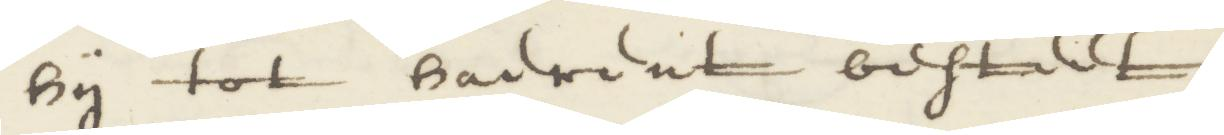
hij tot haerent besteet
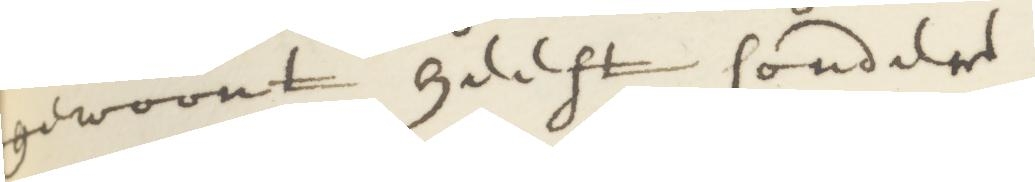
gewoont heeft sonder
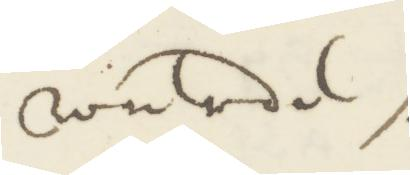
wierde /
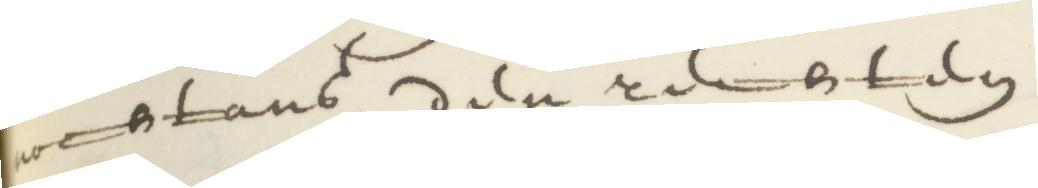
nochtans den rechten
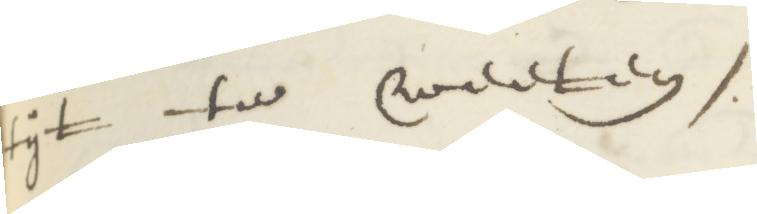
tijt te weeten /.
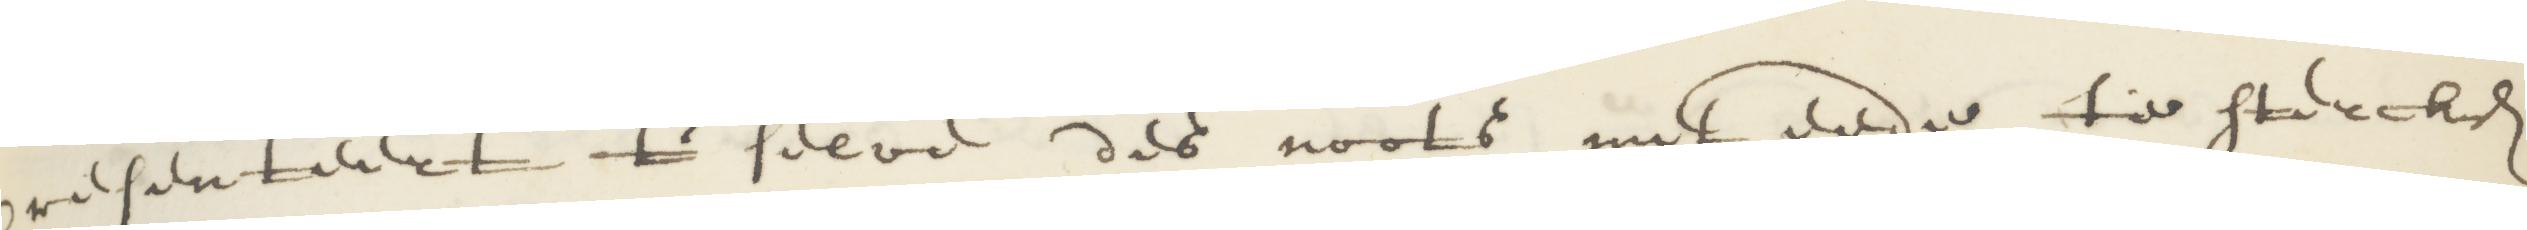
Presenteert t' selve des noots met eede te stercken
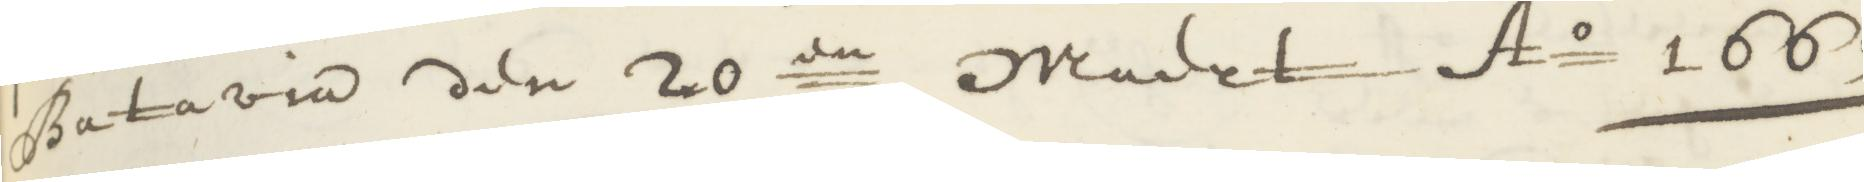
Batavia den 20=en Maert A=o 1665
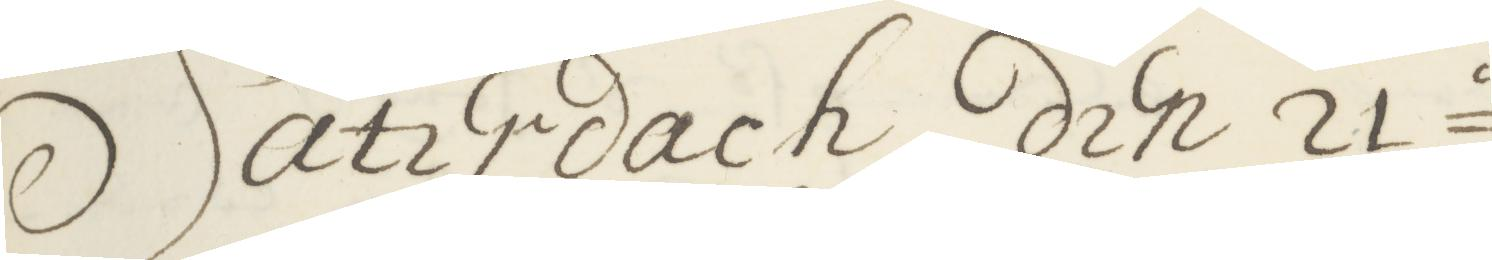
Saterdach den 21=en Marti 1665
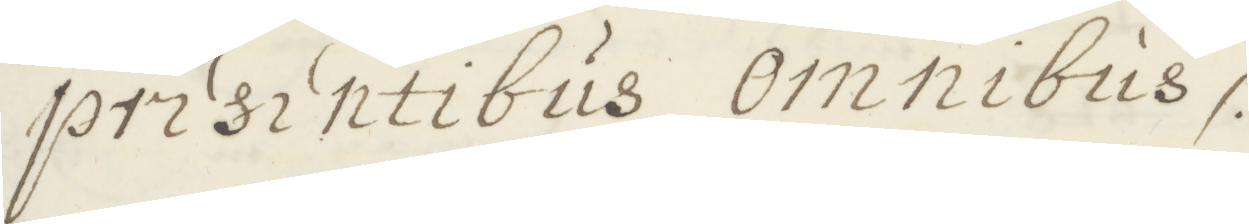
presentibus omnibus /.
